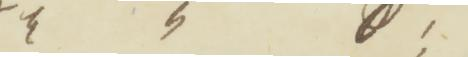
„ „ d:o
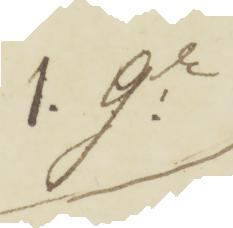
1. g:r
